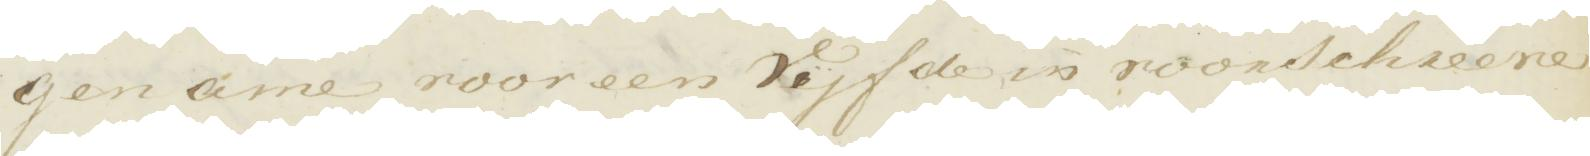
gename voor een Vijfde in voorschreeve
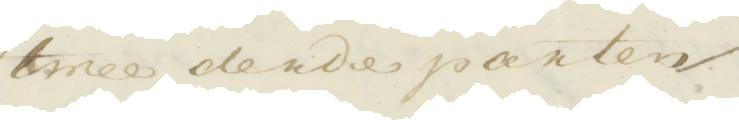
twee derde parten
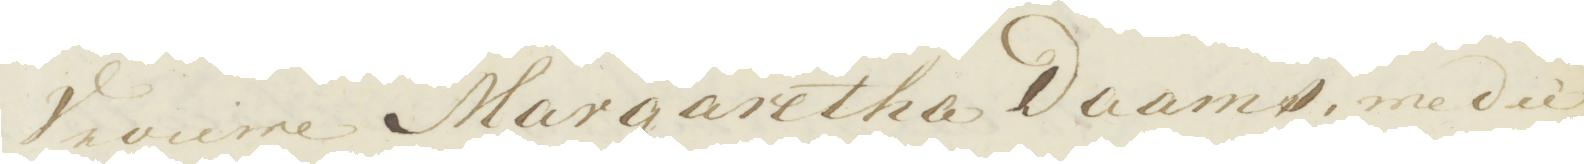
Vrouwe Margaretha Daams, wedu
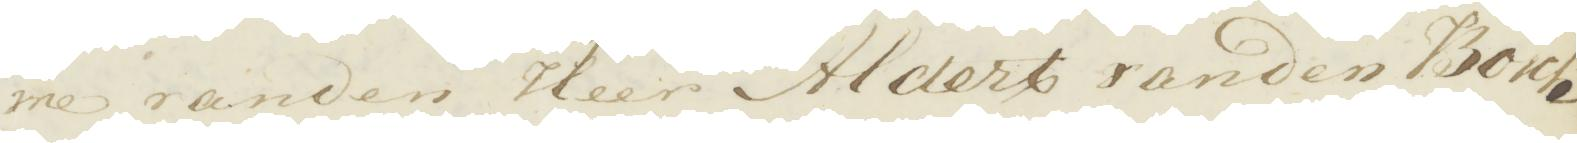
we van den Heer Aldert van den Borch
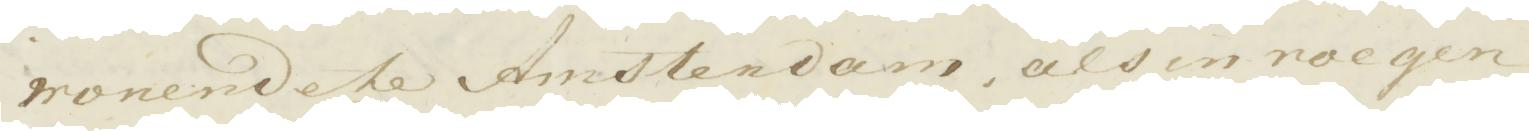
wonende te Amsterdam , als in voegen
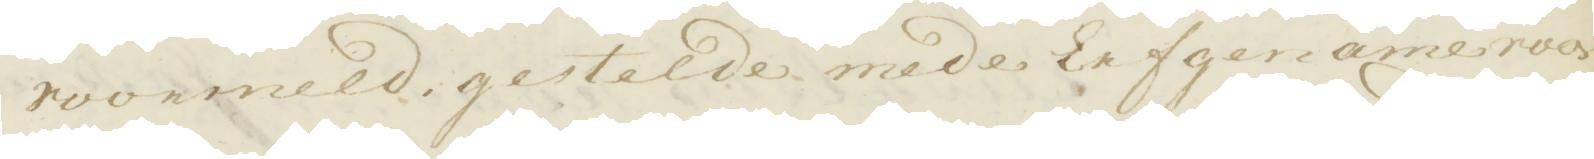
voormeld, gestelde mede Erfgename voor
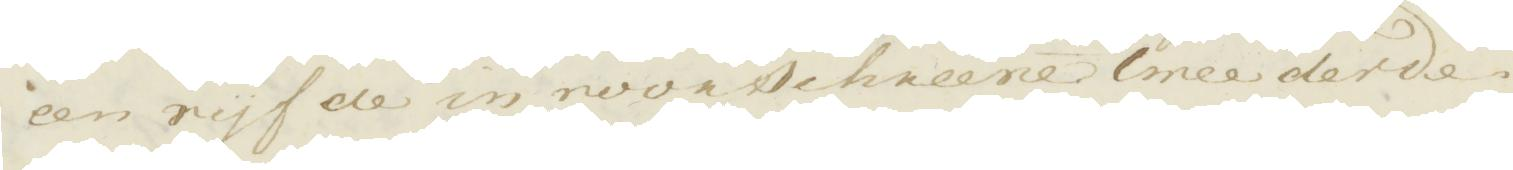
een vijfde in voorschreeve twee derde
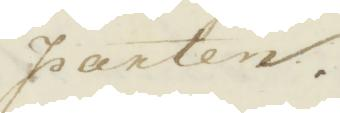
parten.
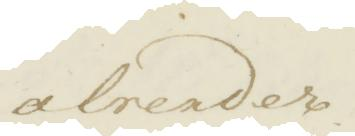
alverder
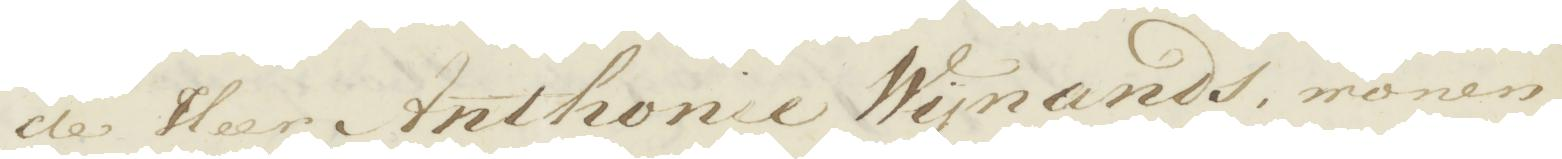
de Heer Anthonie Wijnands, wonen
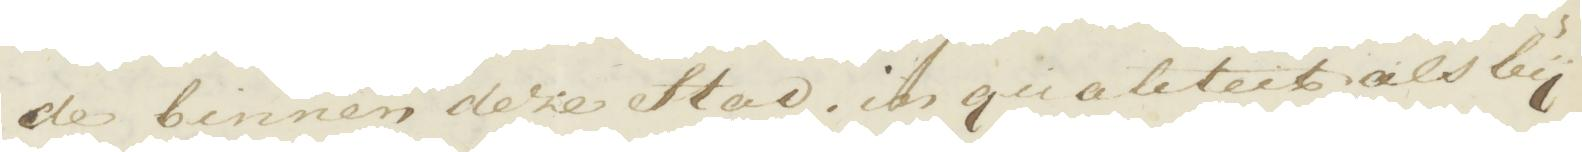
de binnen deze Stad, in qualiteit als bij
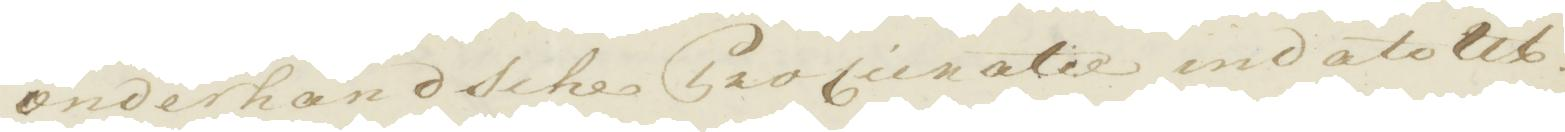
onderhandsche Procuratie in dato Ut
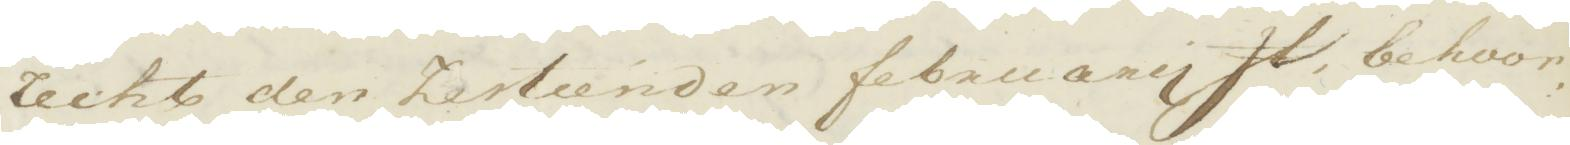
recht den Zestienden februarij Jl, behoor„
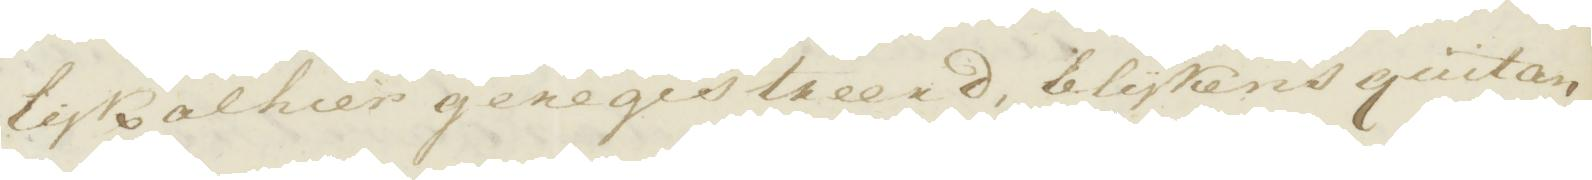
lijk alhier geregistreerd, blijkens quitan
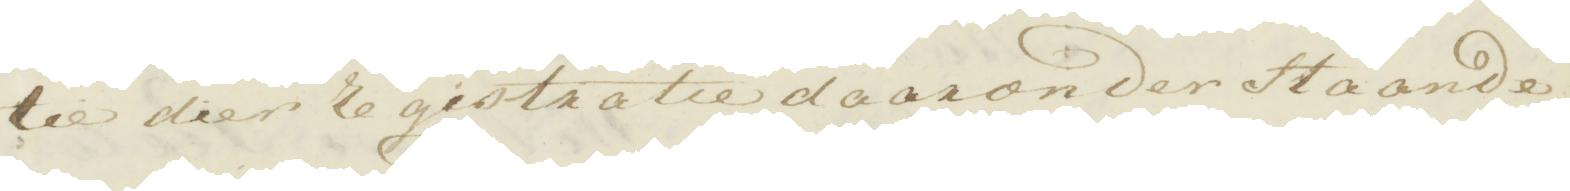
tie dier registratie daar onder staande,
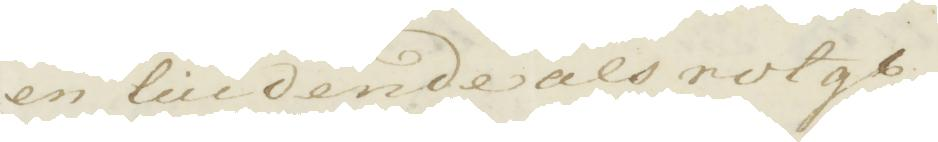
en luidende als volgt
